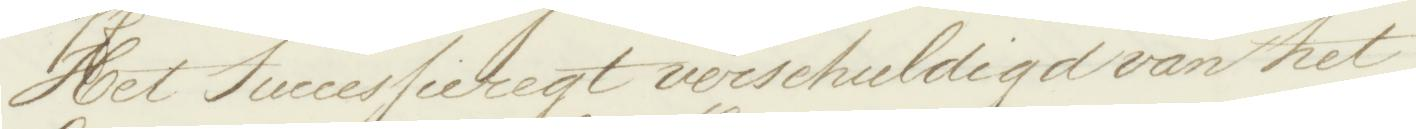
Het Successieregt verschuldigd van het
